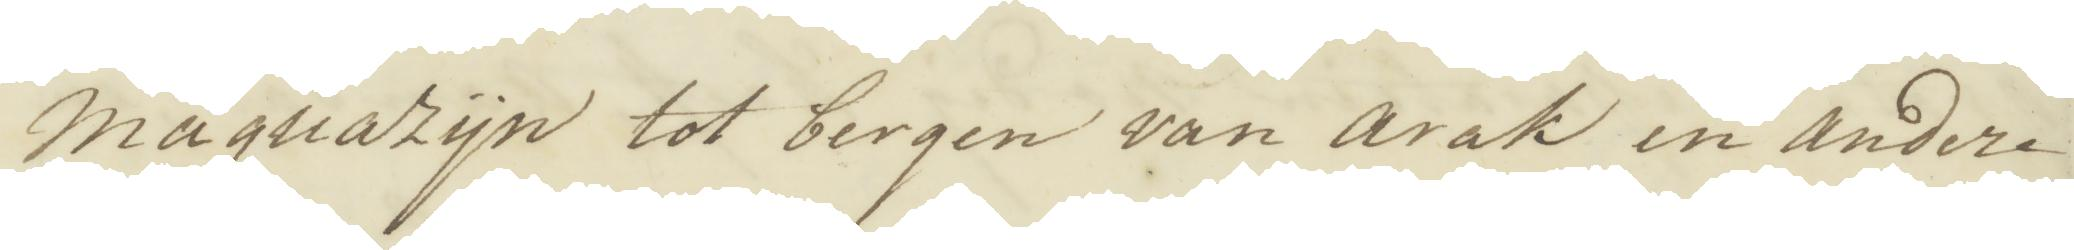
maguazijn tot bergen van arak en andere
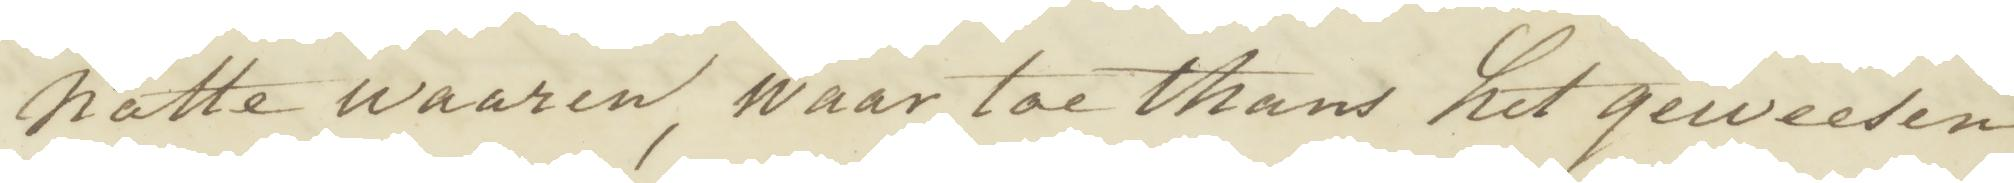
natte waaren, waar toe thans het geweesen
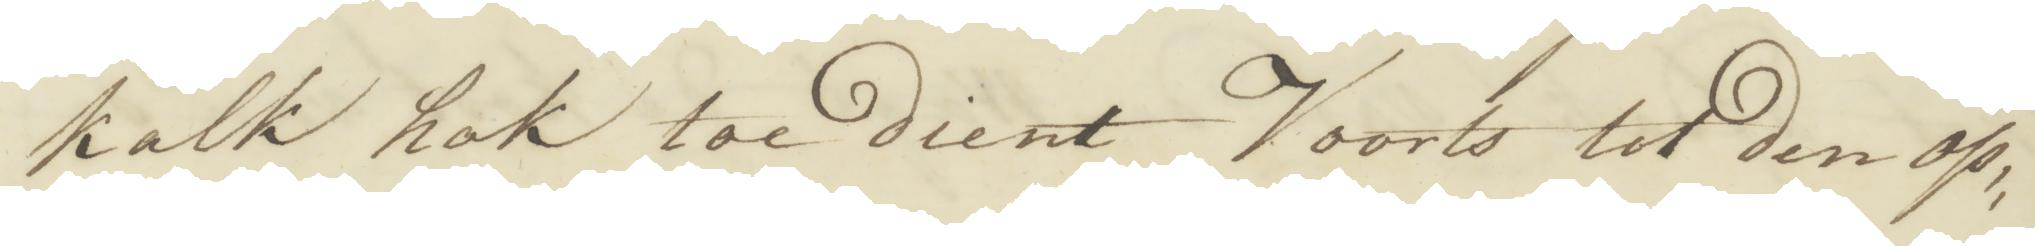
kalk hok toe dient, Voorts tot den op„
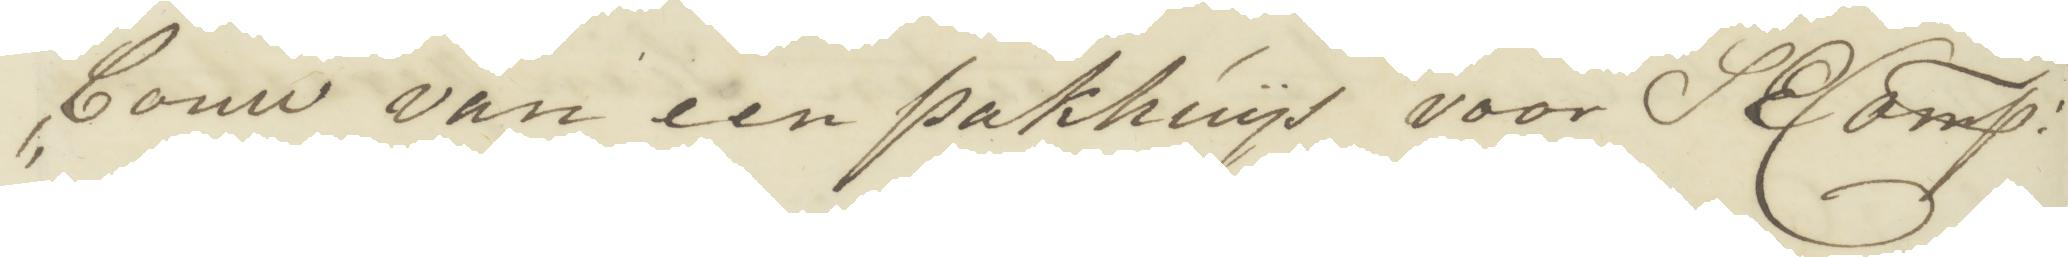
„bouw van een pakhuijs voor sEComp:
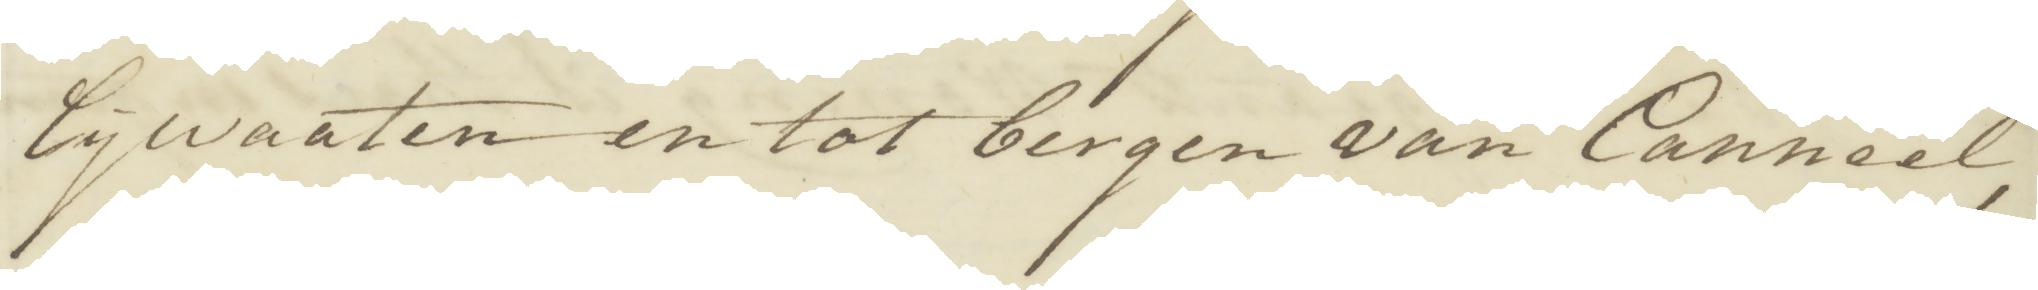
lijwaaten en tot bergen van Canneel,
